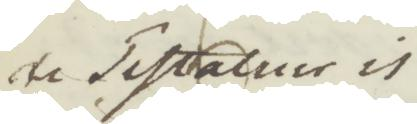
de Testateur is
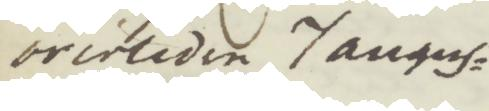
overleden 7 augus=
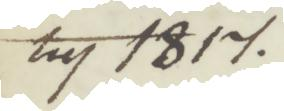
tus 1817.
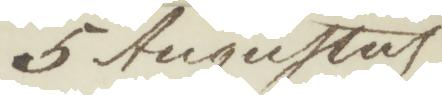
5 Augustus
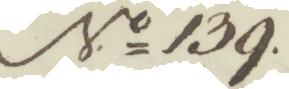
N=o 139.
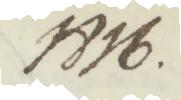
1816.
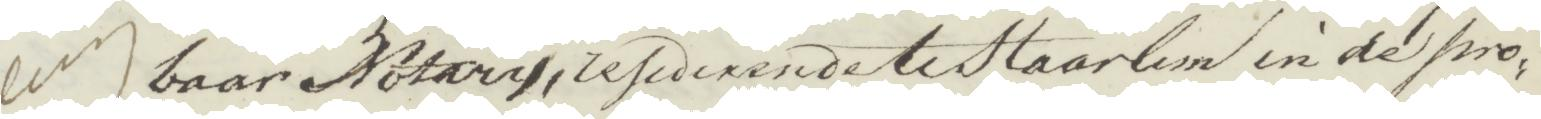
baar Notaris, residerende te Haarlem in de pro„
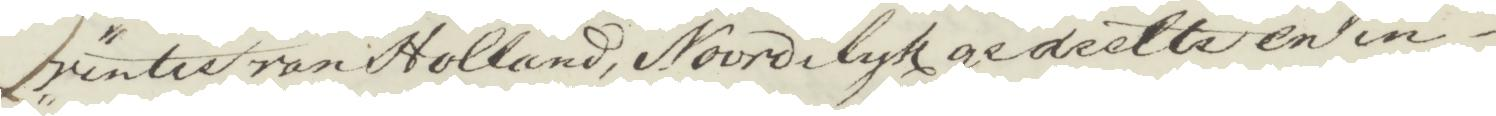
„vintie van Holland, Noordelyk gedeelte en in
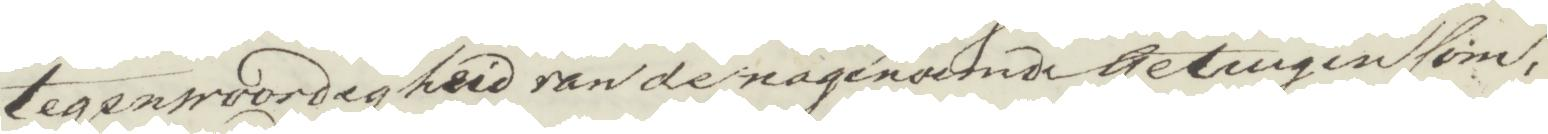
tegenwoordigheid van de nagenoemde getuigen Com„
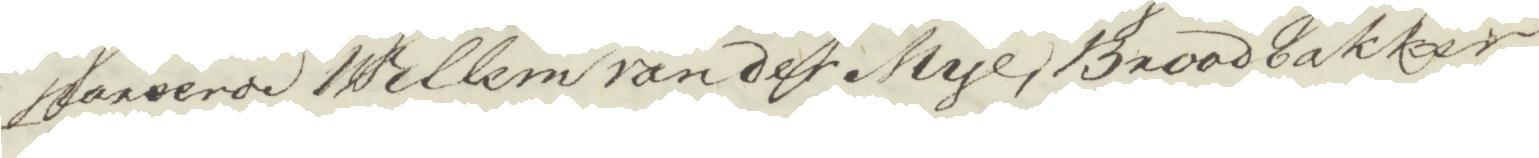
„pareerde Willem van der Mye, Broodbakker,
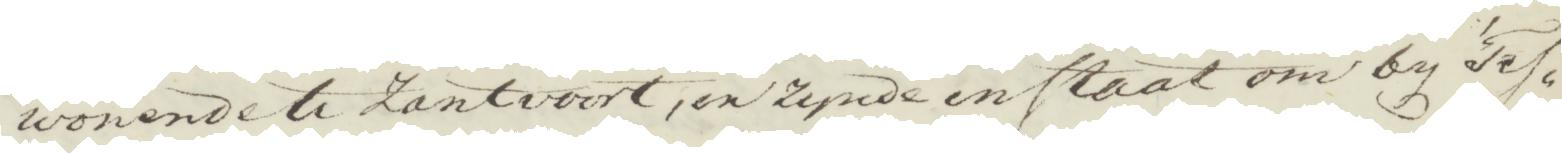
wonende te Zantvoort, en zynde in staat om by Tes„
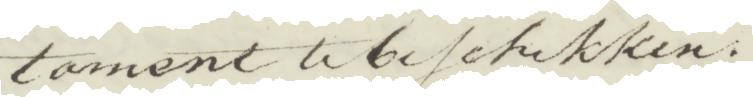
tament te beschikken.
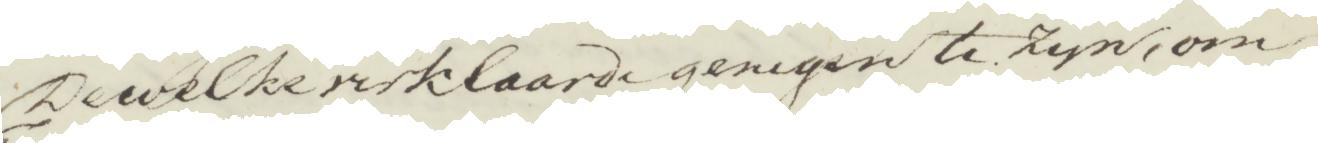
Dewelke verklaarde genegen te zyn, om
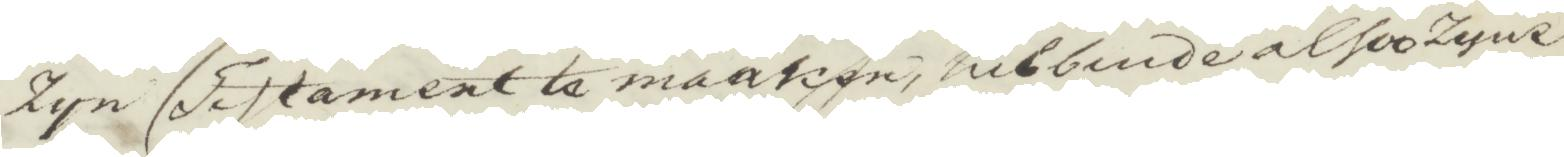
zyn Testament te maaken, hebbende alsoo zyne
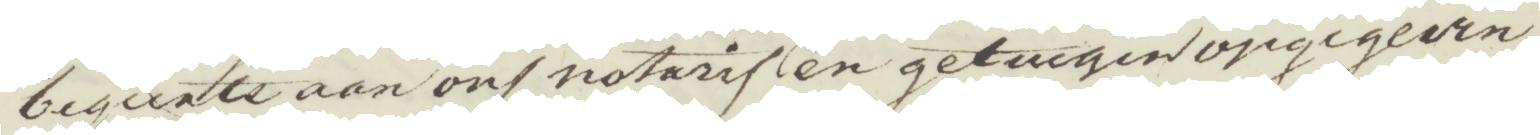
begeerte aan ons notaris en getuigen opgegeven,
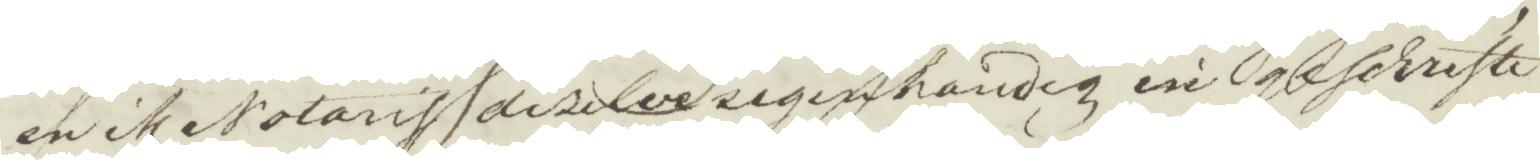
en ik Notaris dezelve eigenhandig in geschrifte
